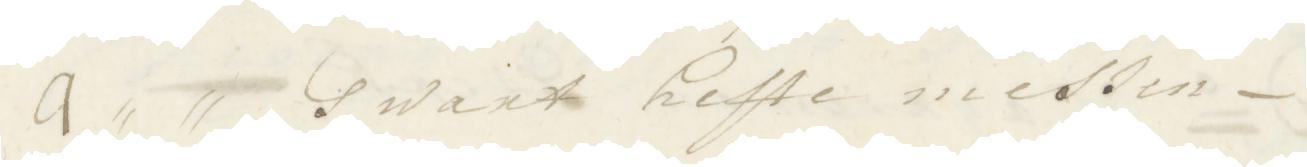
4 „ „ swart hefte messen —
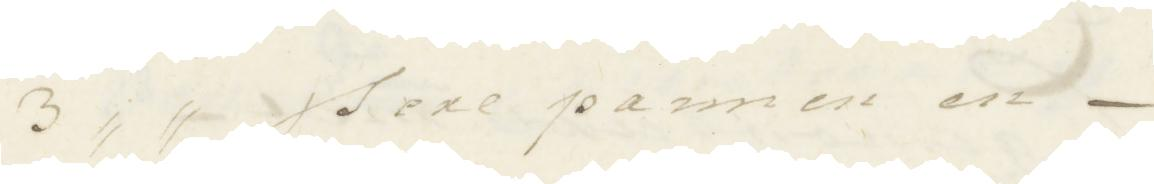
3 „ „ Jsere pannen en —
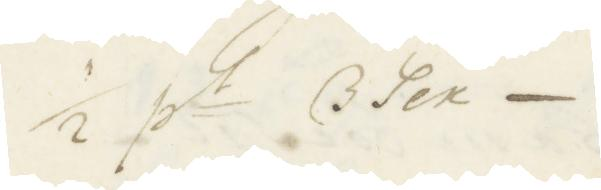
½ p=t 3 ser —
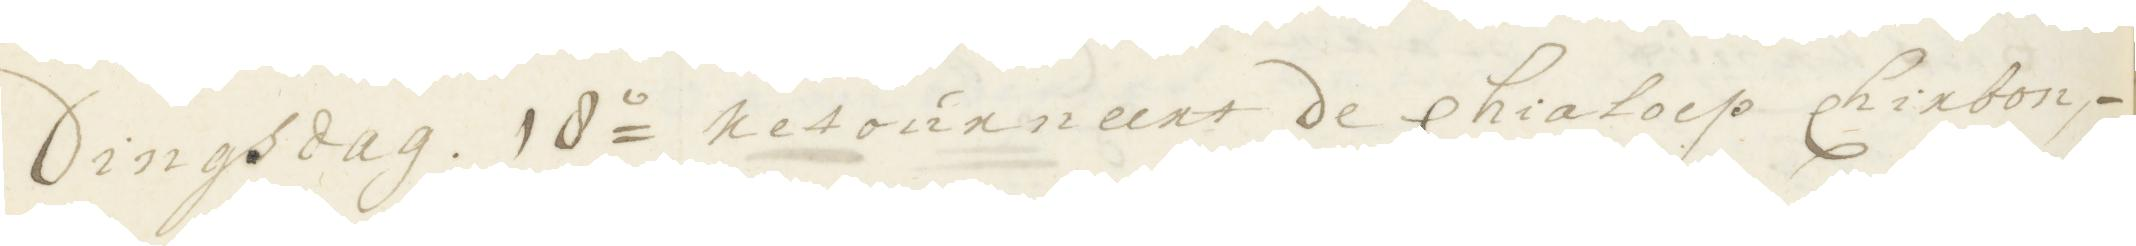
Dingsdag. 18=e retourneert de chialoep chirbon, —
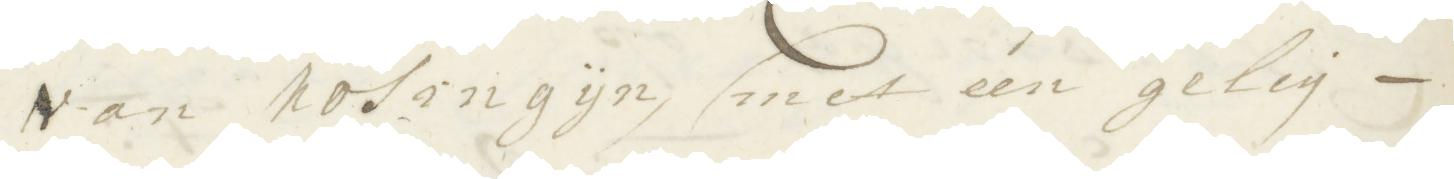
van rosingijn, met een geleij —
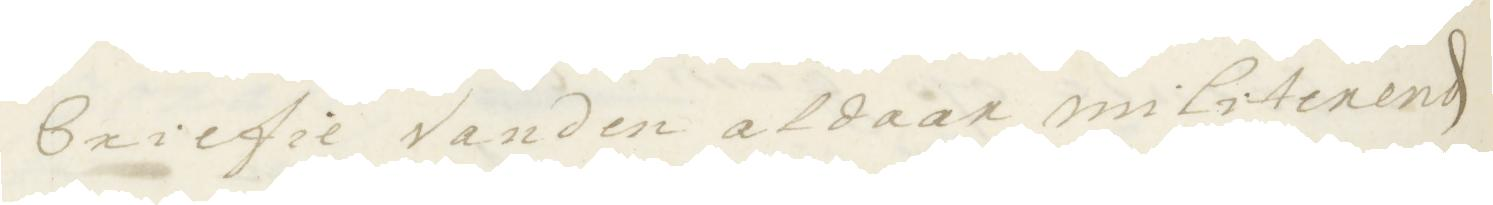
briefie van den aldaar militerend
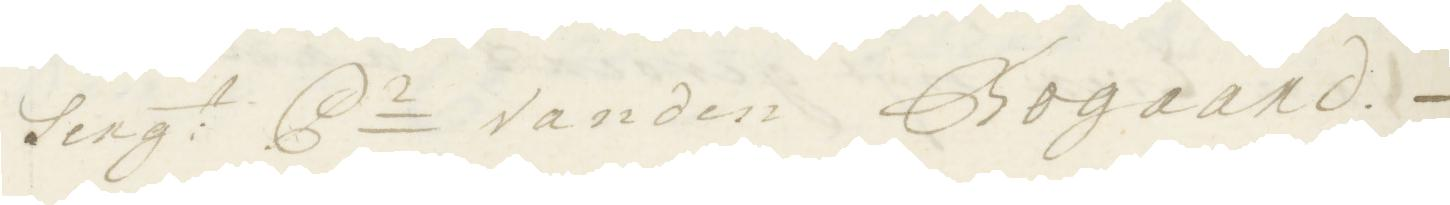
serg:t P=r van den Bogaard. —
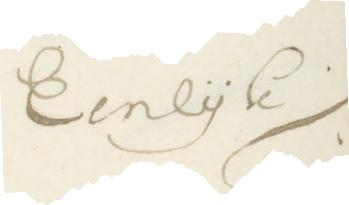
Eenlijk /
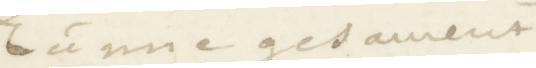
hunne gesament
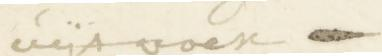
uijtvoer —
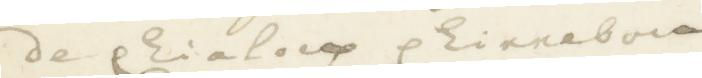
de chialoep chirrabon
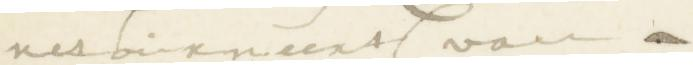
retourneert van —
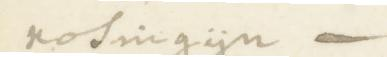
rosingijn —
